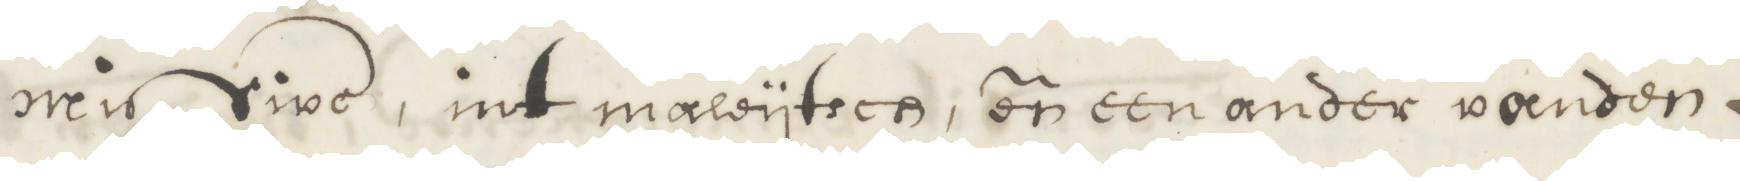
missive, int maleijtsch, en een ander vanden
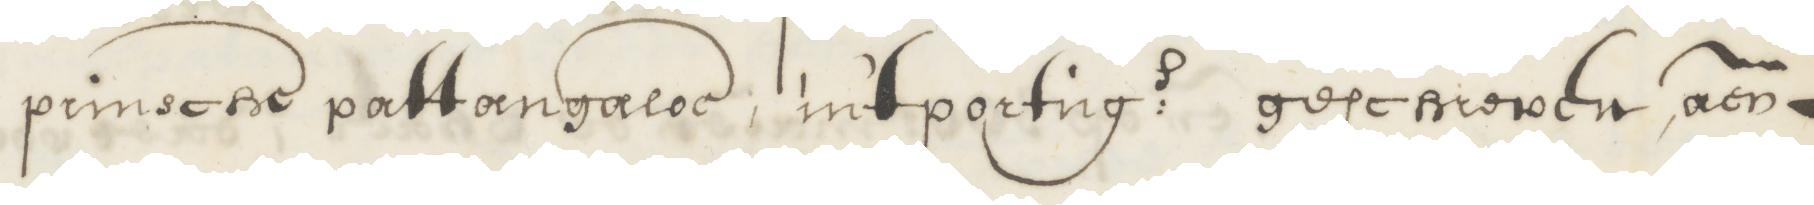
prinsche pattangaloe, in ’t portug:s geschreven, aen
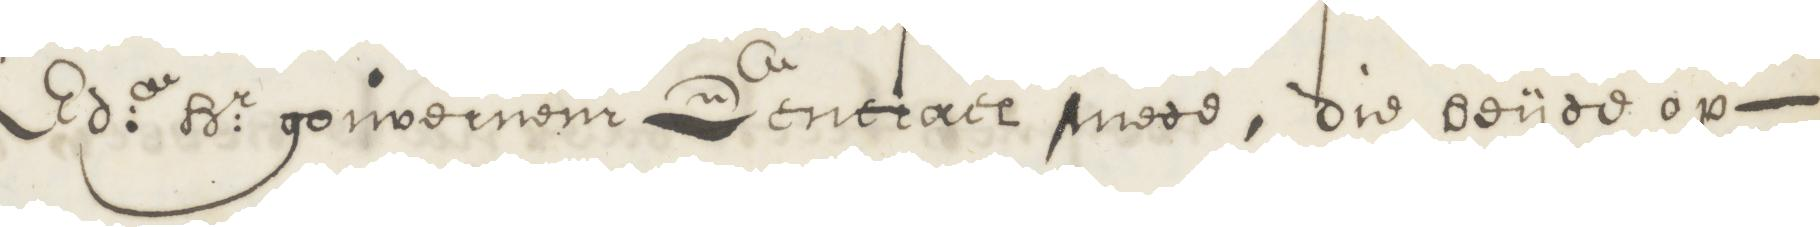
Ed:e H:r gouverneur Generael mede, die beijde op —
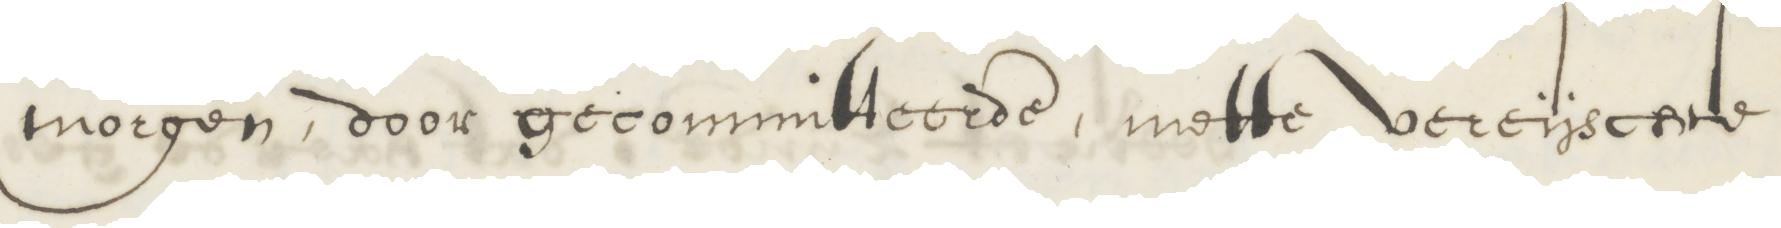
morgen, door gecommitteerde, mette vereijschte
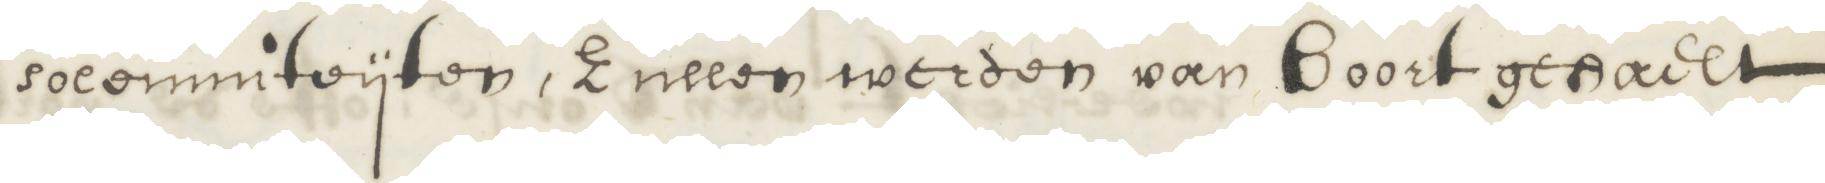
solemniteijten, zullen werden van boort gehaelt,
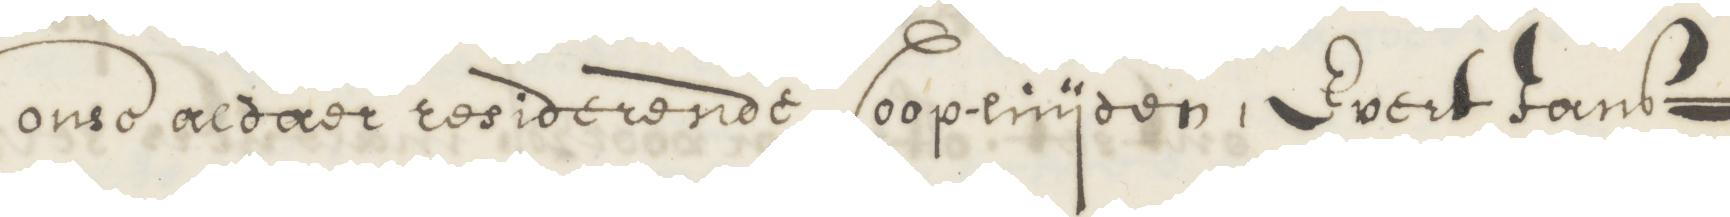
onse aldaer residerende Coop-luijden, Evert Jans=
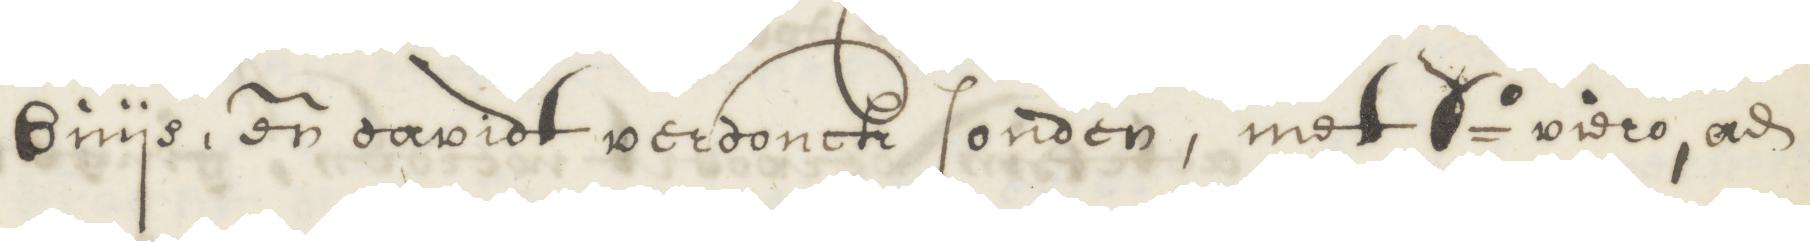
buijs, en davidt verdonck sonden, met d=o viero, aen
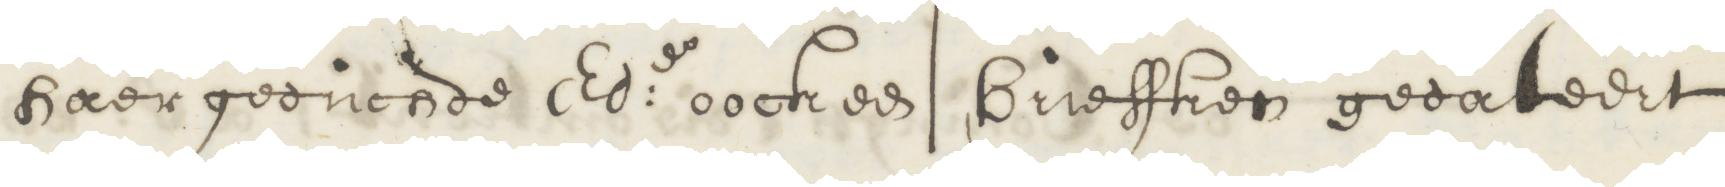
haer geduchde Ed:e oock een brieffken gedateert
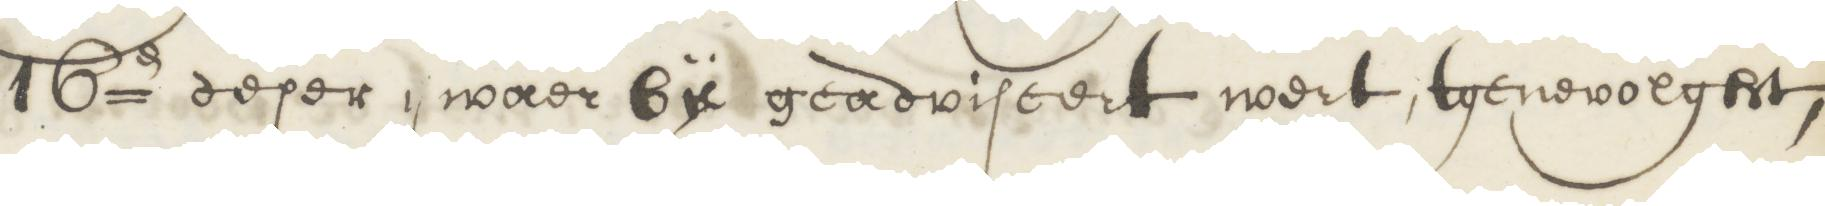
16=en deser, waer bij geadviseert wert, tgenevolght,
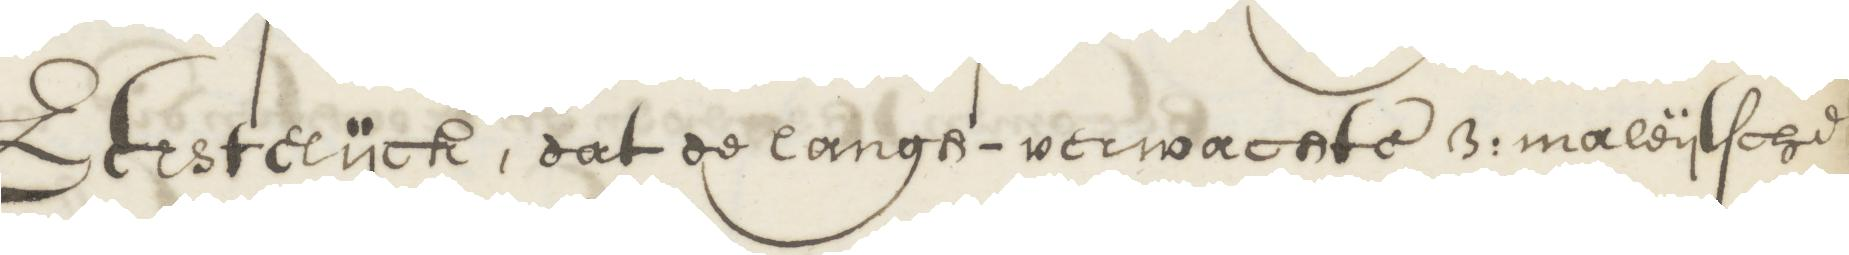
Eerstelijck, dat de langh-verwachte 3: maleijtsche
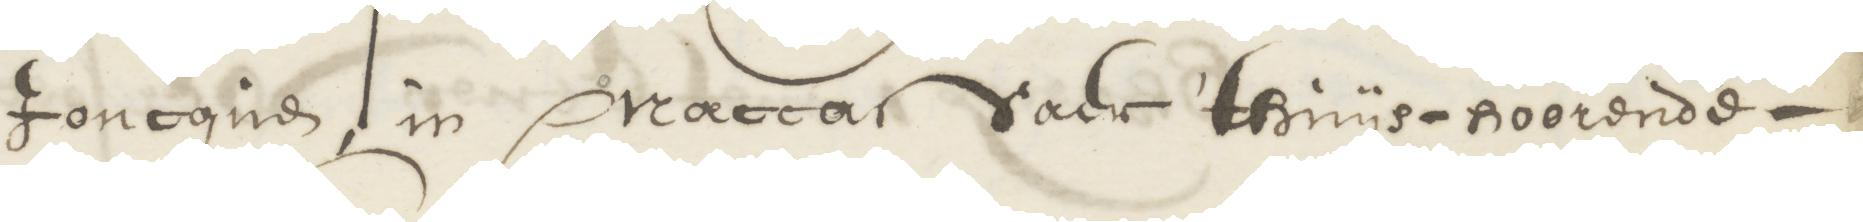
Joncquen, in Maccassaer 't huijs-hoorende -
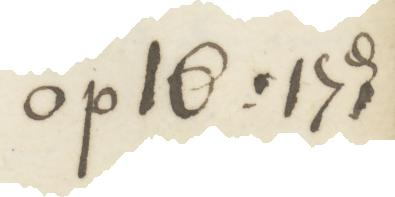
op 16:17en
